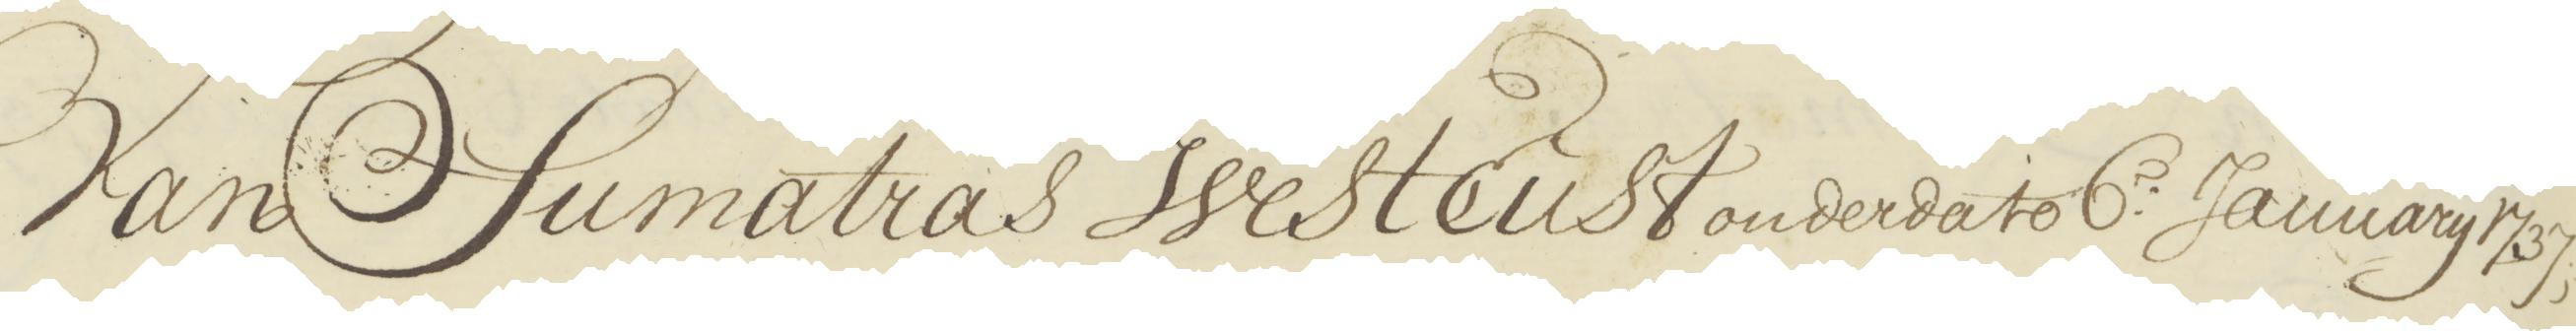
Van Sumatras west cust onder dato 6:' Januarij 1737;
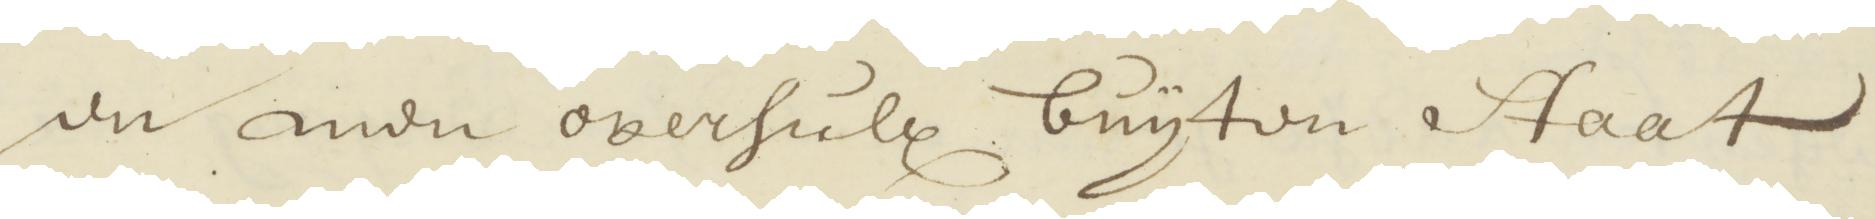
en men oversulx buijten staat
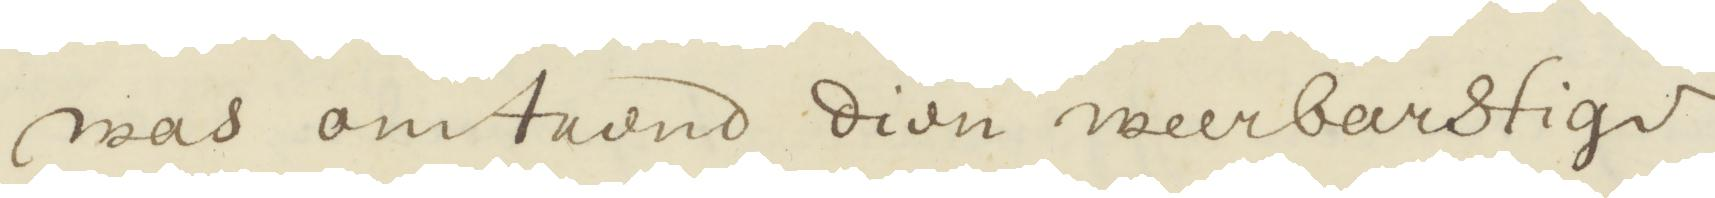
was omtrend dien weerbarstige
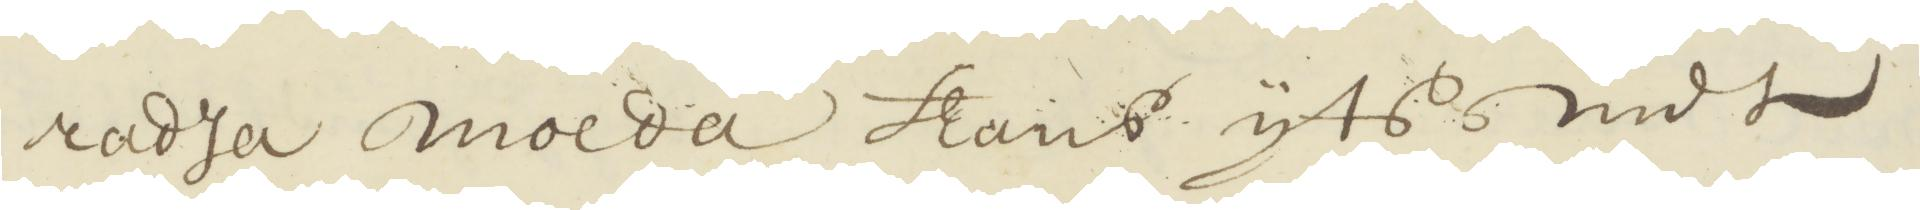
radja moeda thans ijts met
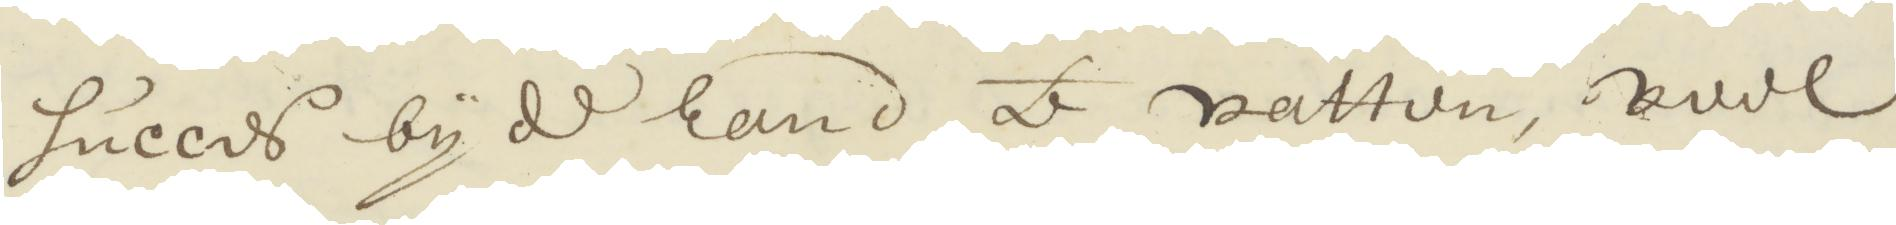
succes bij de hand te vatten, veel
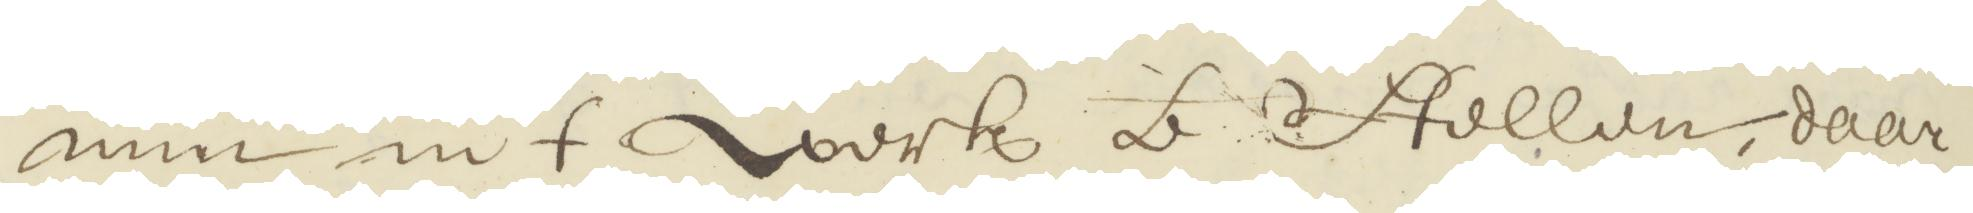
min in ’t werk te stellen, daar
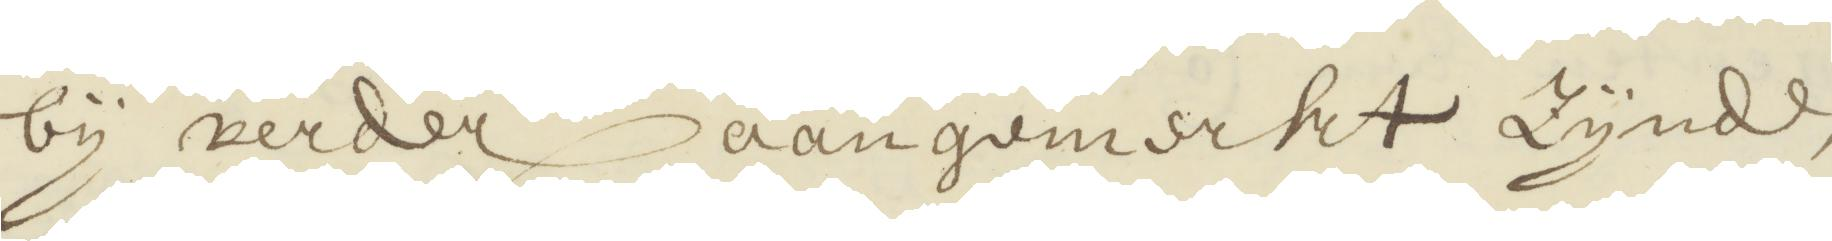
bij verder aangemerkt zijnde,
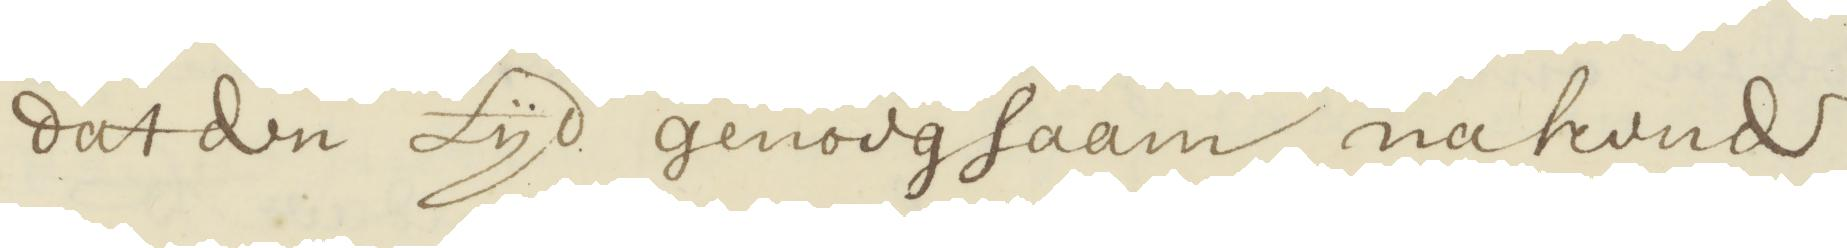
dat den tijd genoegsaam nakende
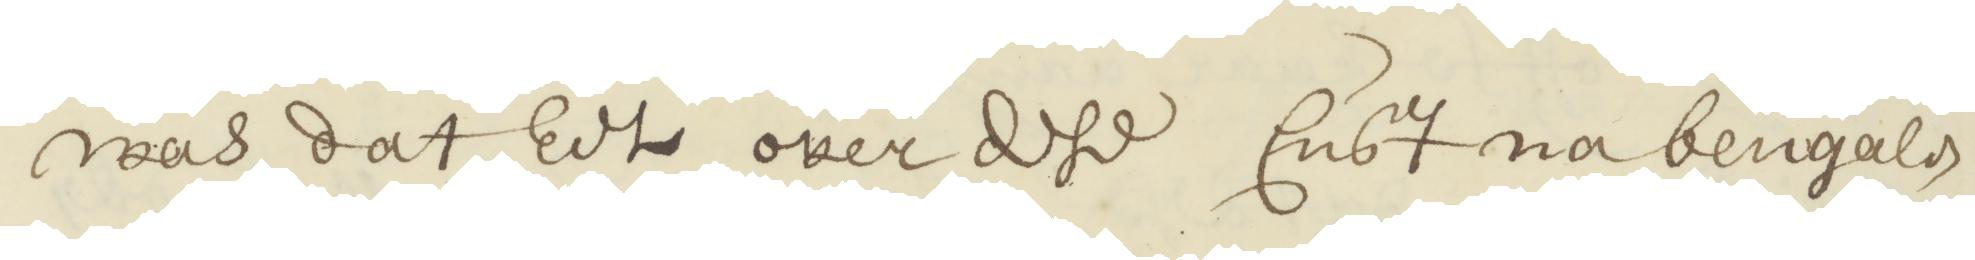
was dat het over dese Cust na bengalen
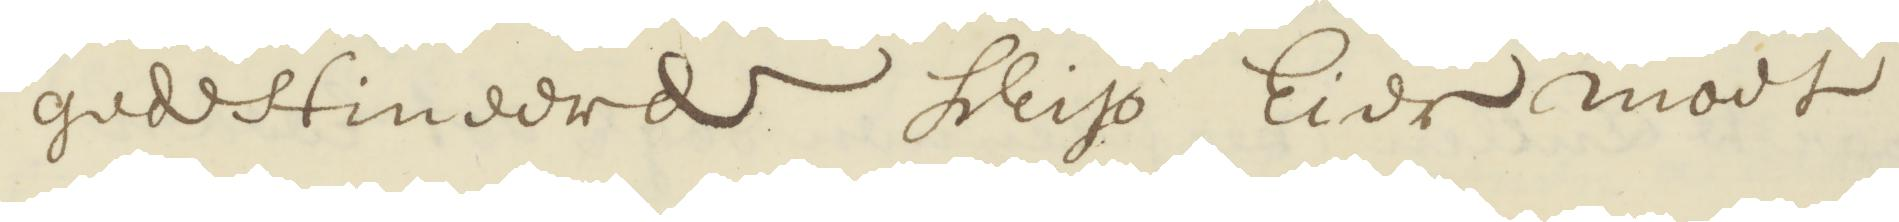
gedestineerde schip hier moet
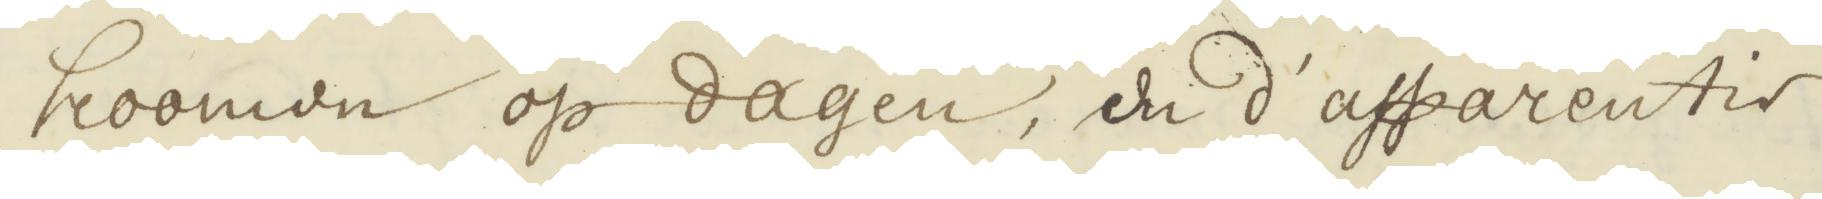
koomen op dagen, en d’ apparentie
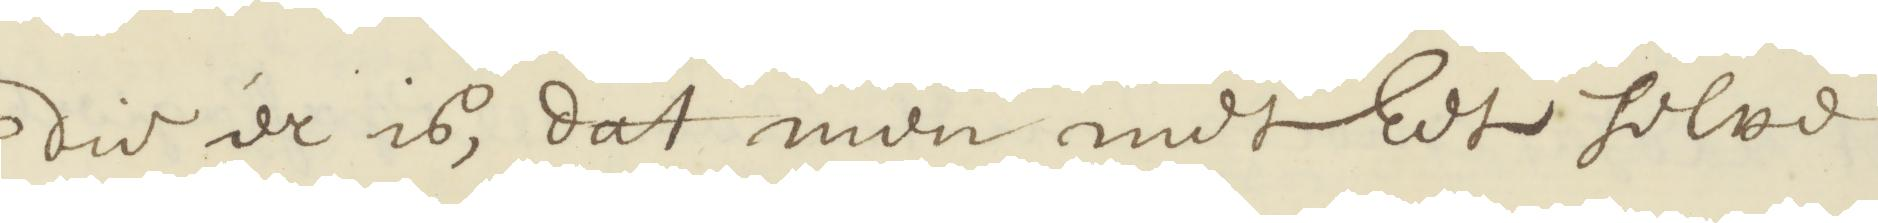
die 'er is, dat men met het selve
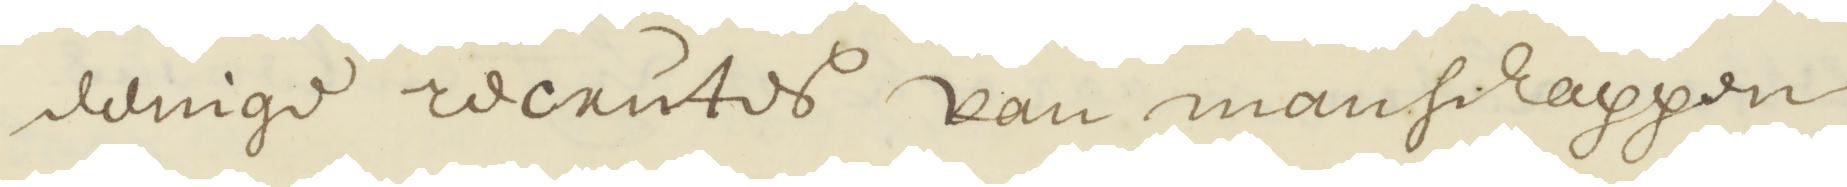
eenige recrutes van manschappen
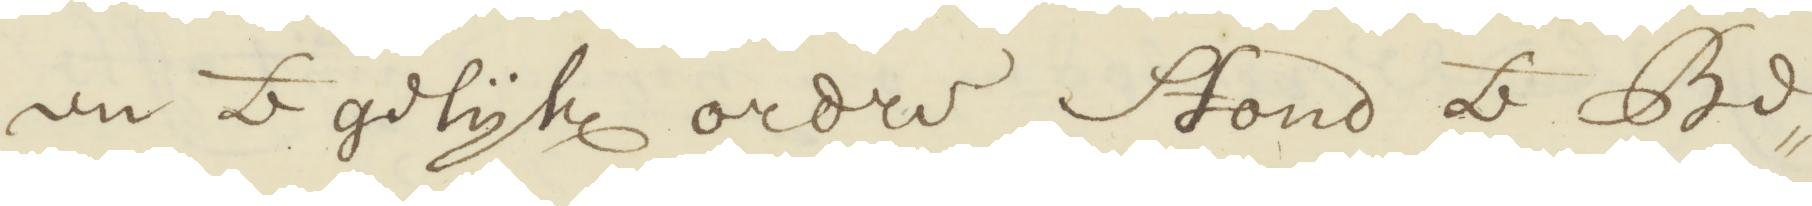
en te gelijk ordre stond te Be„
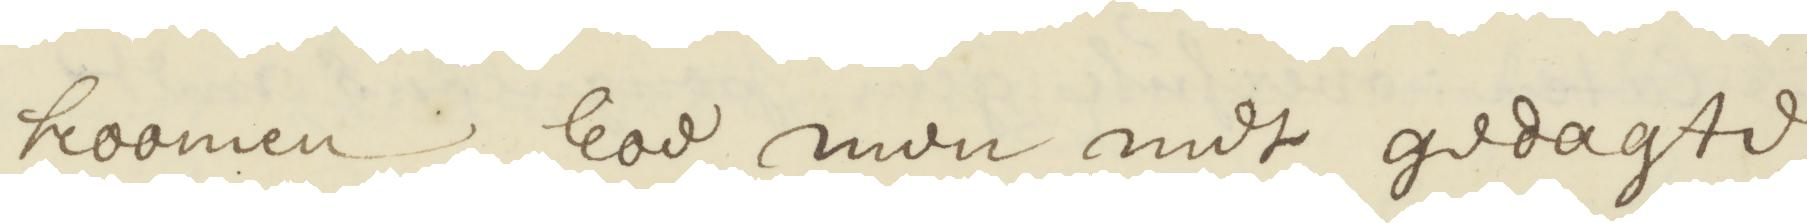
koomen, hoe men met gedagte
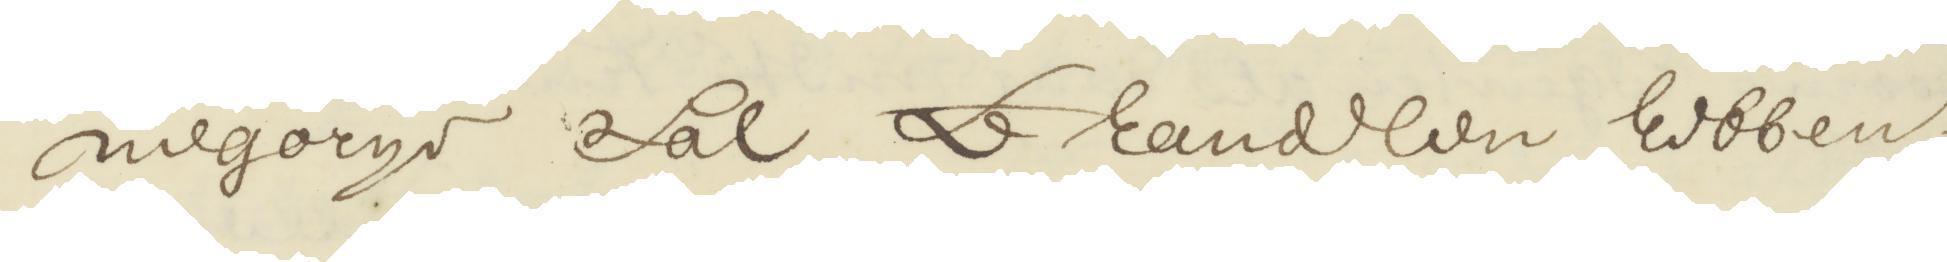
negorije sal te handelen hebben,
